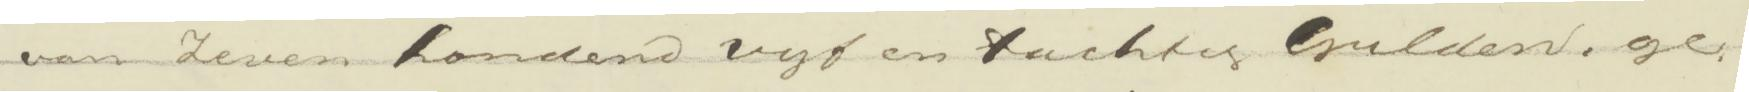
van zeven honderd vyf en tachtig Gulden, ge„
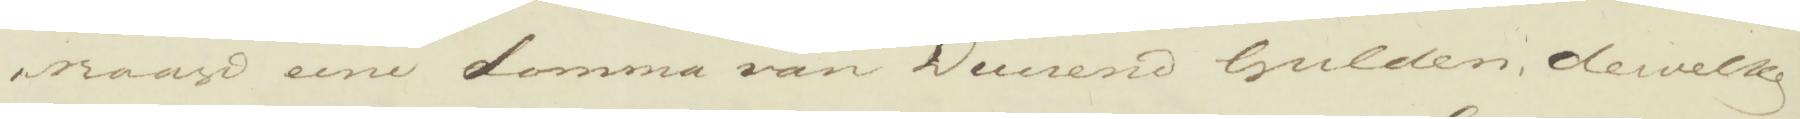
„vraagd eene somma van Duizend Gulden, dewelke
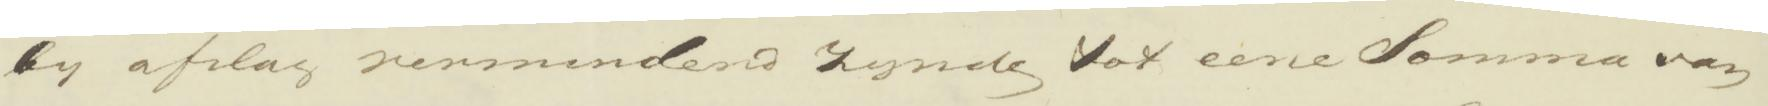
by afslag verminderd zynde tot eene Somma van
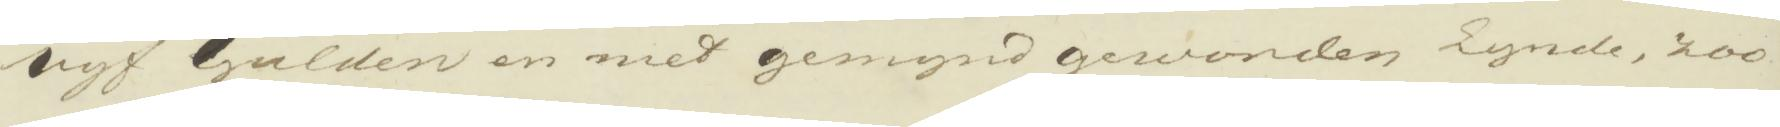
vyf Gulden en niet gemynd geworden zynde, zoo
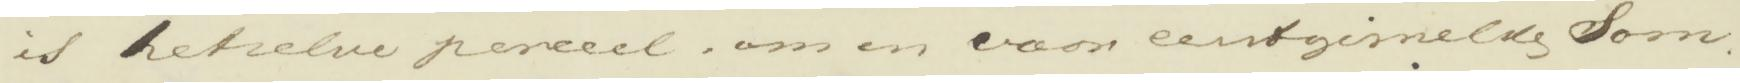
is hetzelve perceel, om en voor eerstgemelde Som
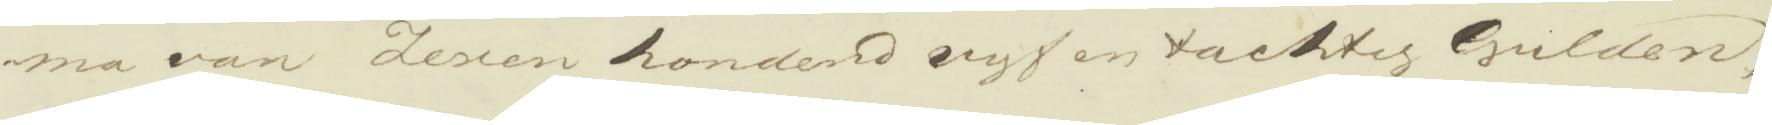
„ma van Zeven honderd vyf en tachtig Gulden,
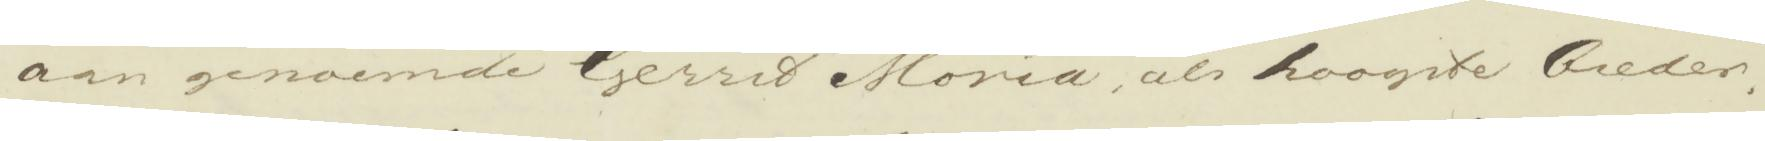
aan genoemde Gerrit Moria, als hoogste bieder,
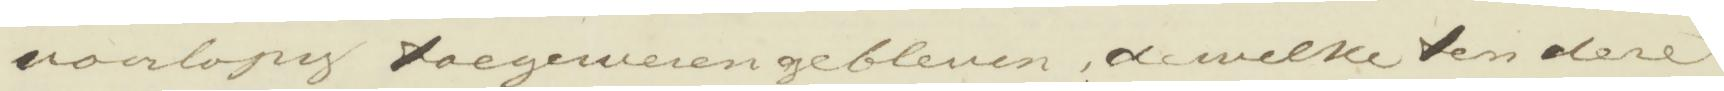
voorlopig toegewezen gebleven, de welke ten deze
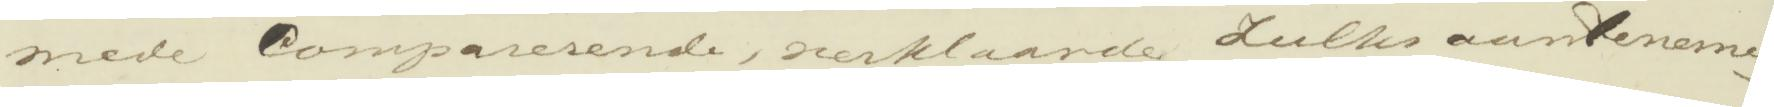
mede Comparerende, verklaarde zulks aanteneme
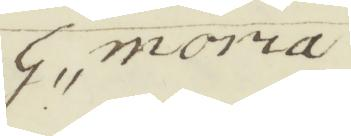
G„ moria
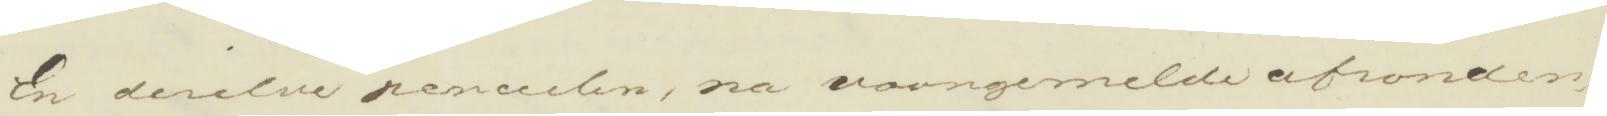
En dezelve perceelen, na voorgemelde afzonder,
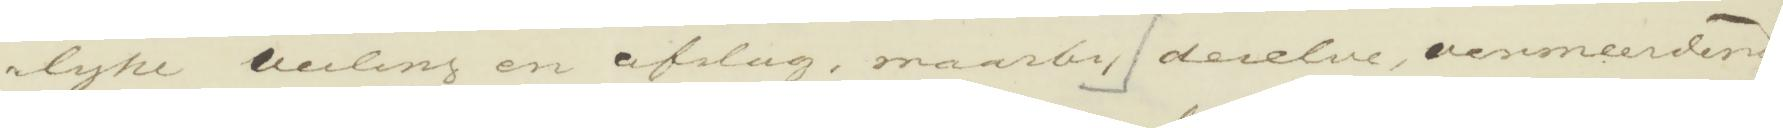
„lyke veiling en afslag, waarbij] dezelve, vermeerderd
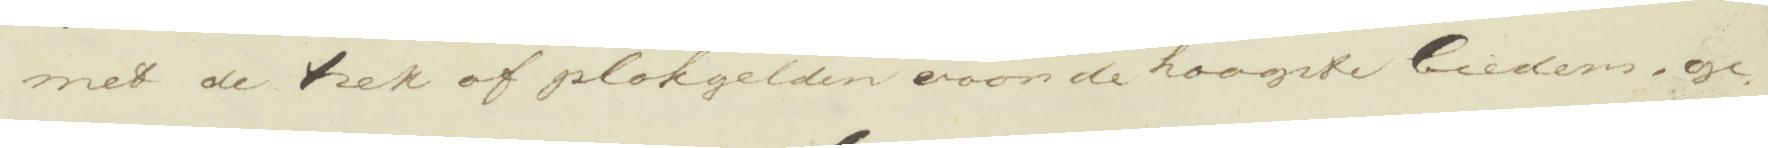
met de trek of plokgelden voor de hoogste bieders, ge,
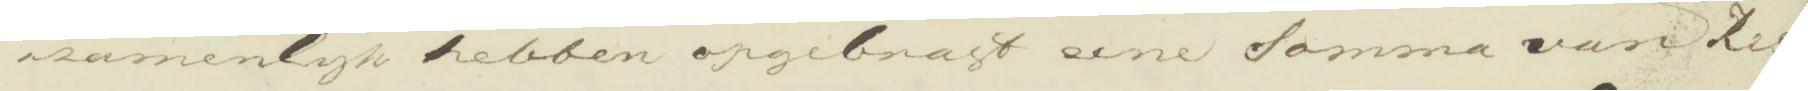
„zamenlyk hebben opgebragt eene Somma van Zes
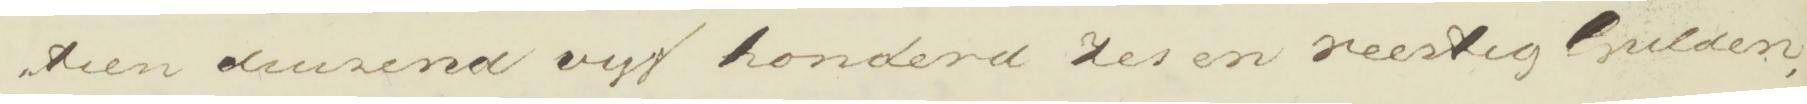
„tien duizend vyf honderd zes en veertig Gulden,
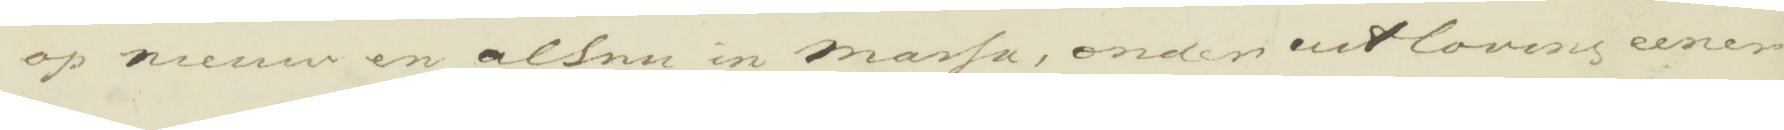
op nieuw en alsnu in massa, onder uitloving eener
